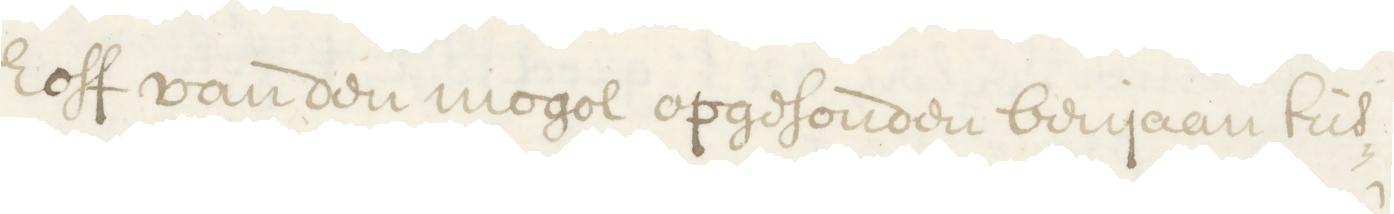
hoff van den mogol opgesonden benjaan kis„
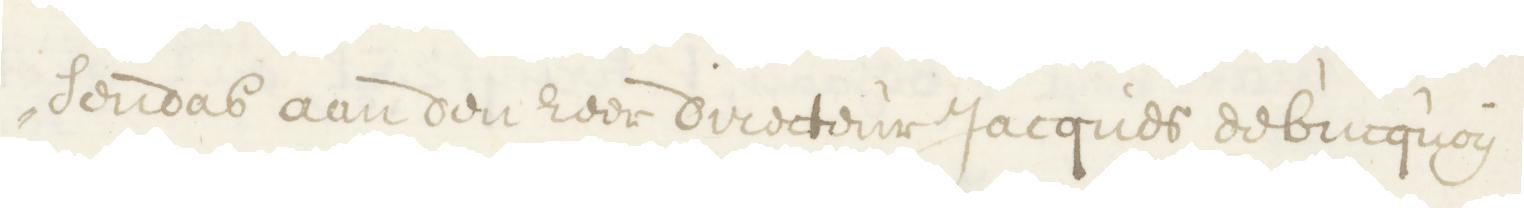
„sendas aan den heer directeur Jacques debucquoij
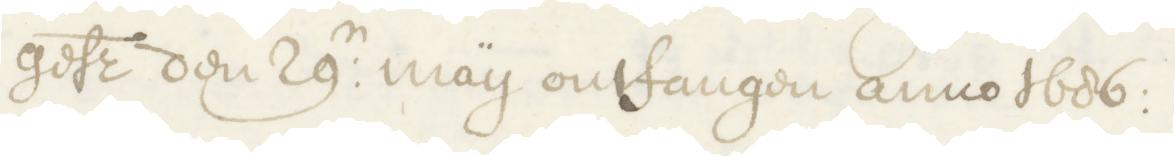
gesz den 29:en maij ontfangen anno 1686:
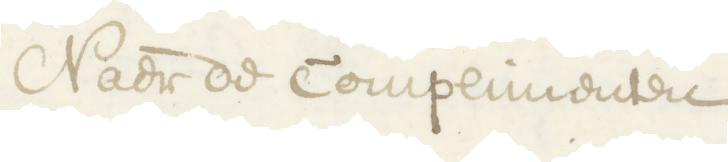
Naer de Complimenten
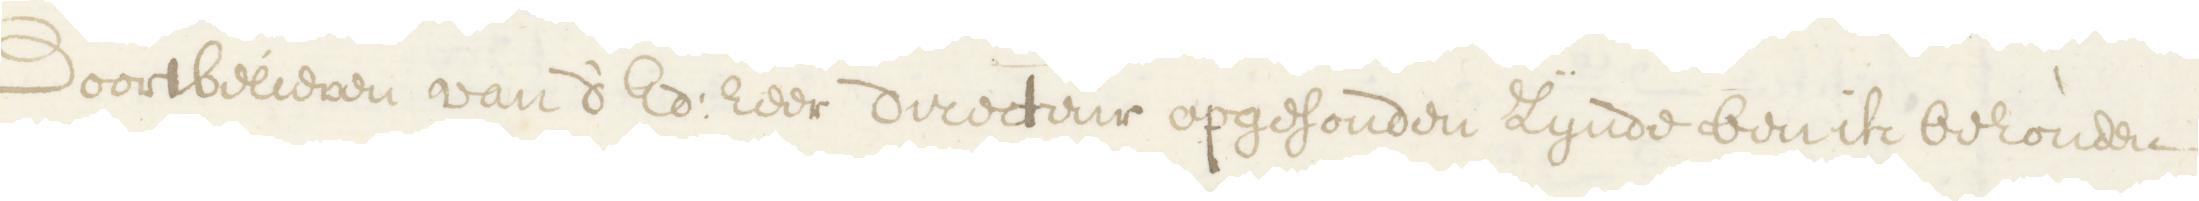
Door'tbelieven van d’ Ed: heer directeur opgesonden zijnde ben ik behouden
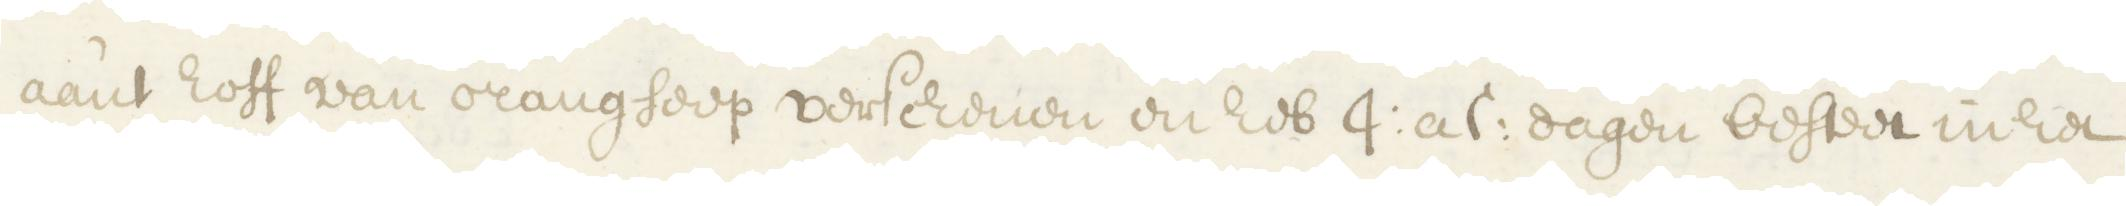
aan’t hoff van orangseep verschenen en heb 4: a 5: dagen besteet in het
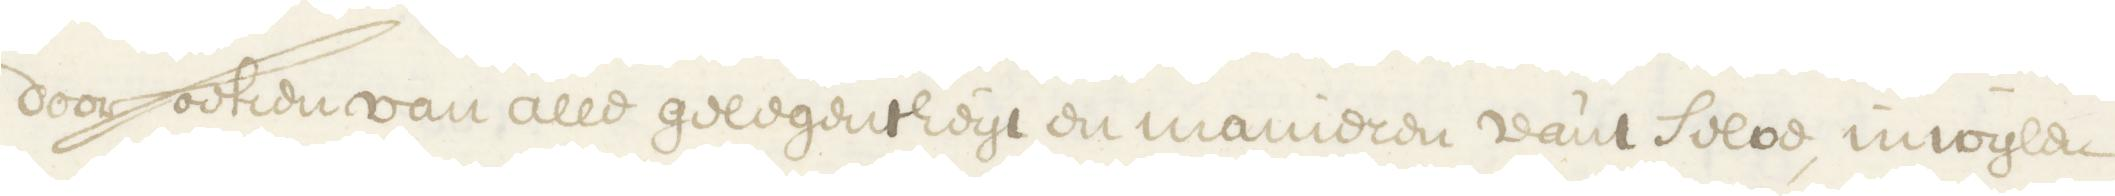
doorsoeken van alle gelegentheijt en manieren van ’t selve inwijlen
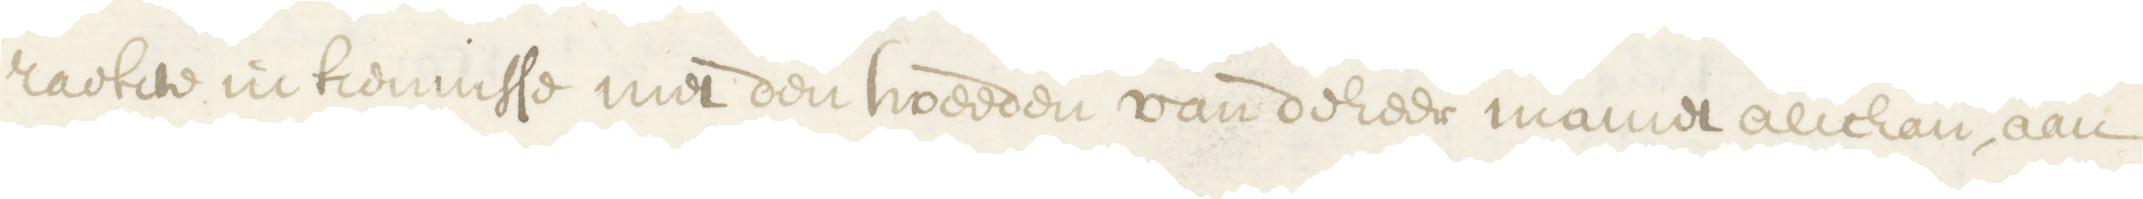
raekte in kennisse met den tweeden van de heer mamet alichan, aan
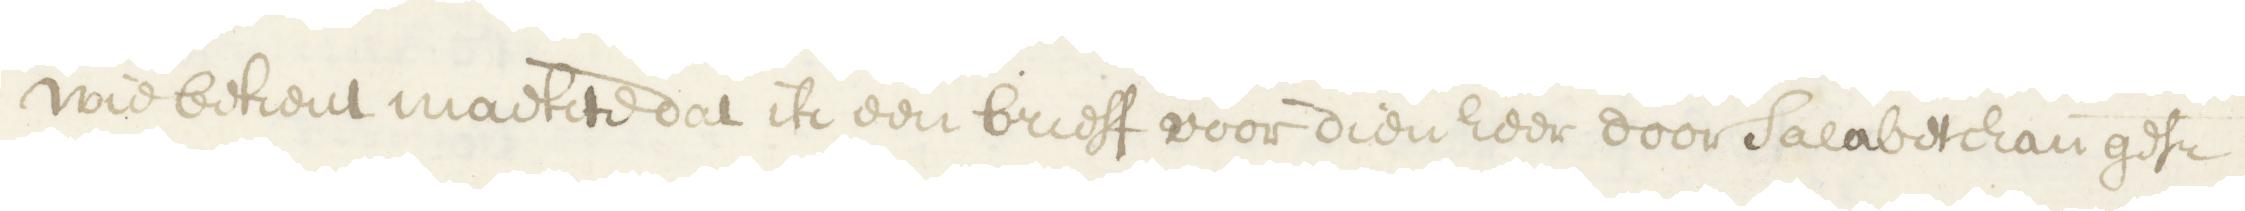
wie bekent maekte dat ik een brieff voor dien heer door salabetchan gesr
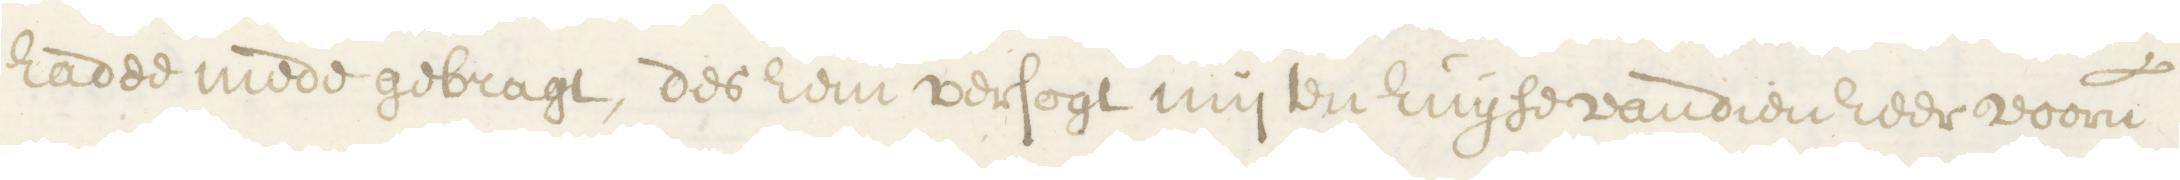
hadde mede gebragt, des hem versogt mij ten huijse van dien heer voorn:
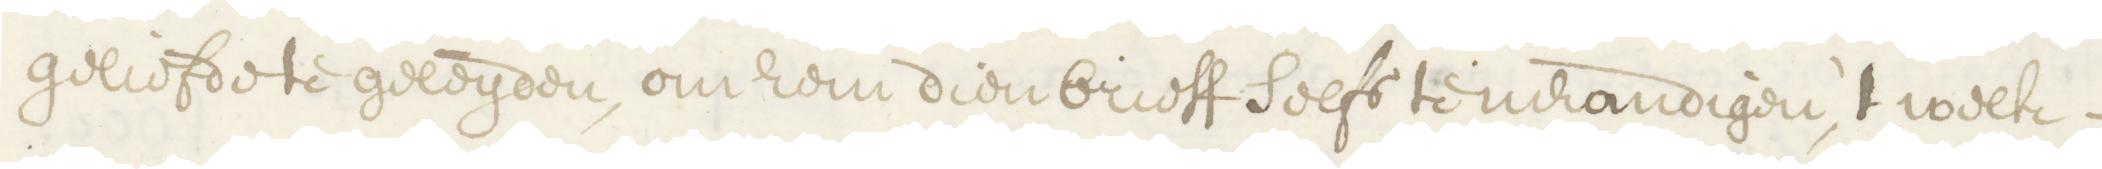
geliefde te geleijden, om hem dien brieff selfs te inhandigen, ’t welk
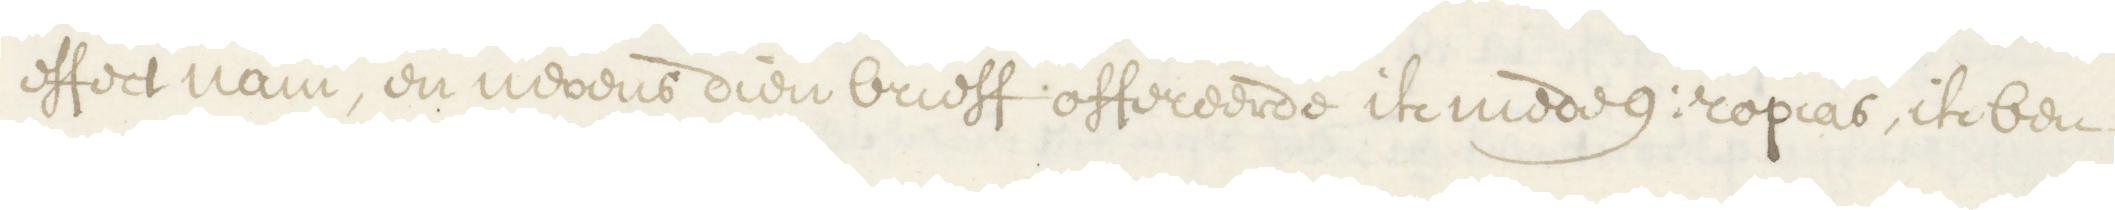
effect nam, en nevens dien brieff offereerde ik mede 9: ropias, ik ben
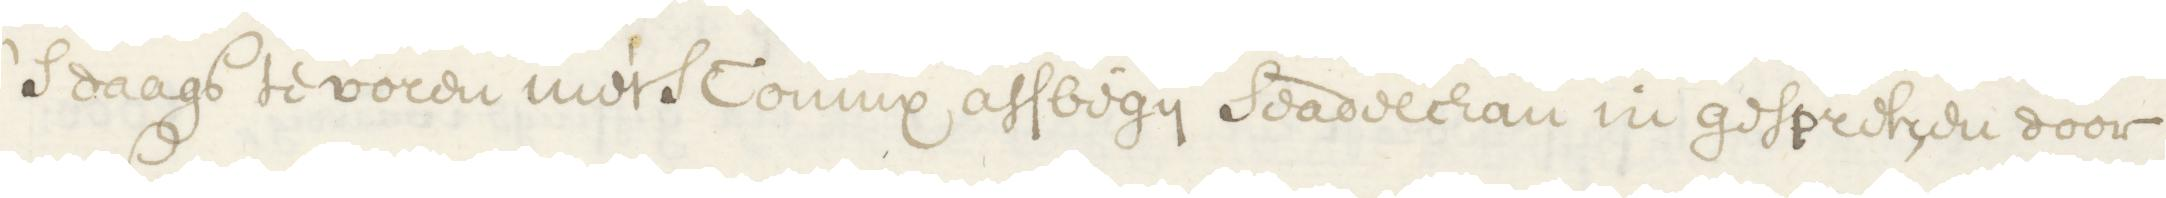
's daags te voren met 'sConinx afsbegij Seadelchan in gespreken door
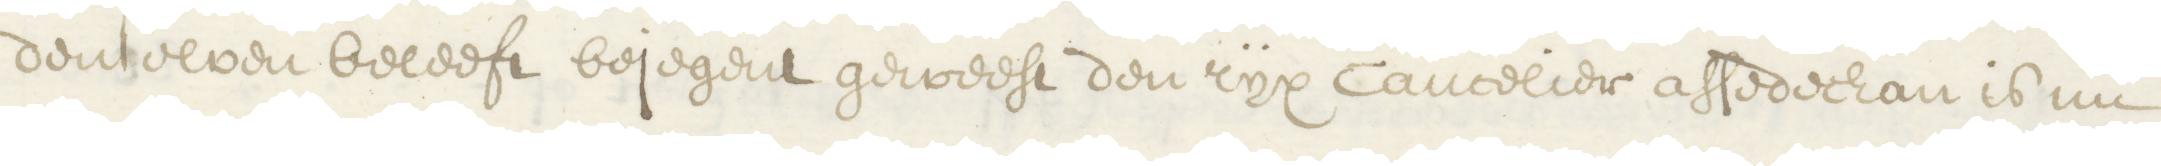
denselven beleeft bejegent geweest den rijx camelier afsedechan is nu
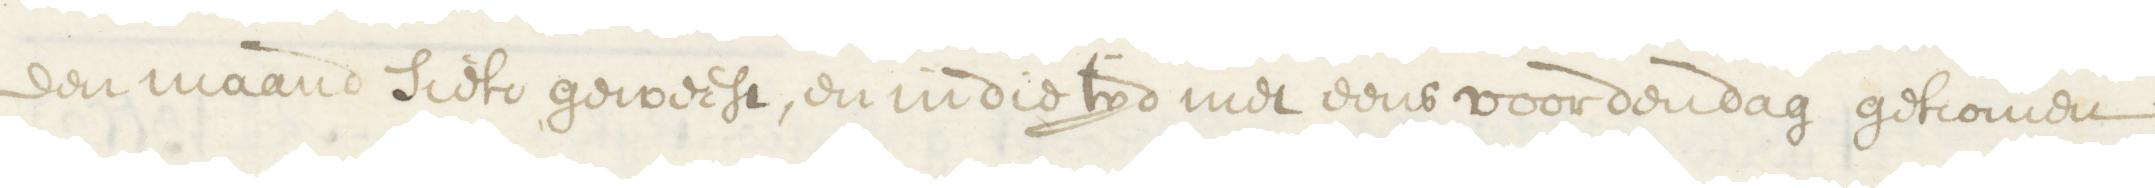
een maand siek geweest, en in die tijd niet eens voor den dag gekomen
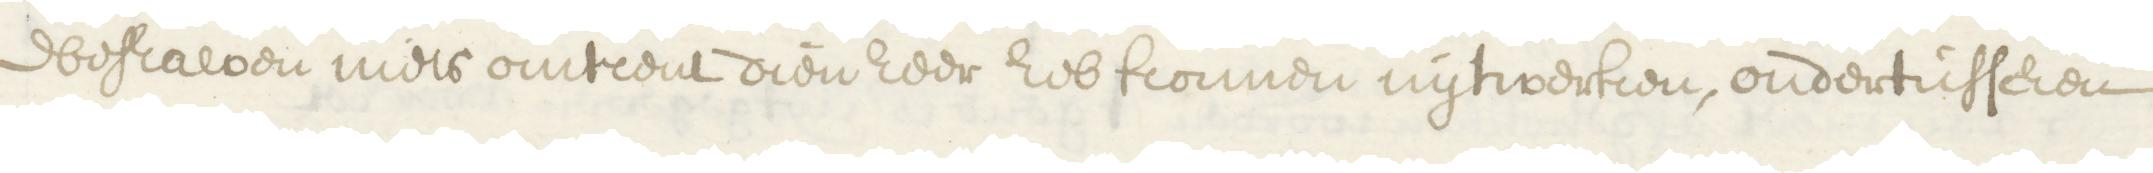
weshalven niets omtrent dien heer heb konnen uijtwerken, ondertusschen
